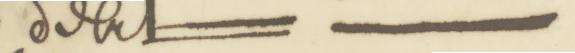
dekt —
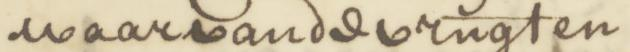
waar van de vrugten
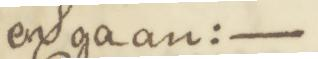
overgaan:—
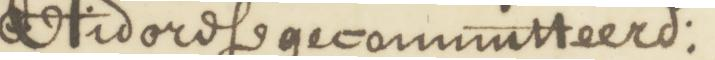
de tidorese gecommitteerd:s
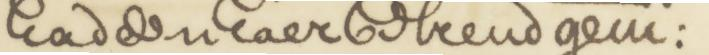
hadden haer bekend gem:t
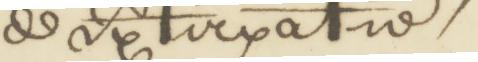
de Extirpatie,
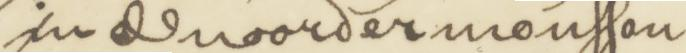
in de noorder mousson
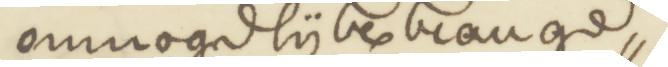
omnogelijk kan ge„
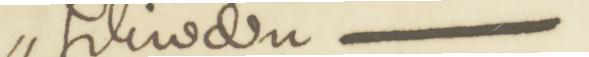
„schieden —
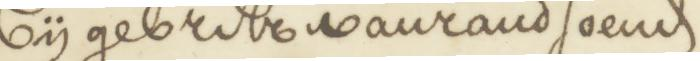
bij gebrek van rand soenen
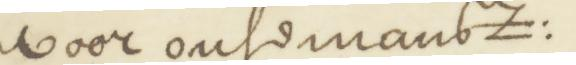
voor onse mansz:
